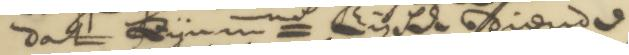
dat zijn m=ns Eijsch diende
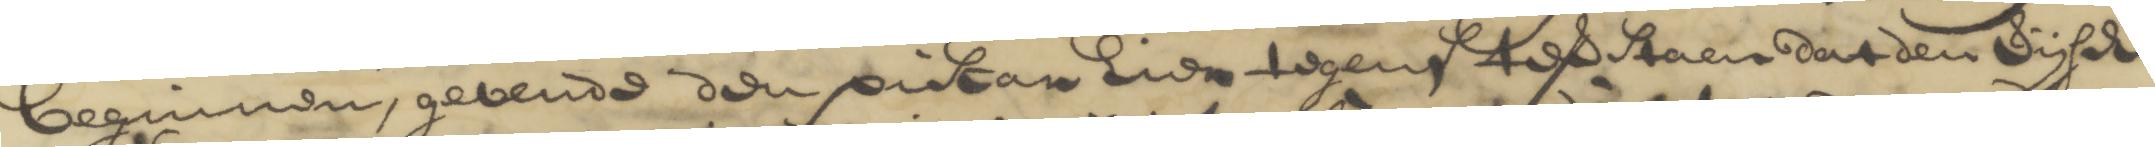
beginnen, gevende den piscar hier tegens te verstaen dat den Eijsch
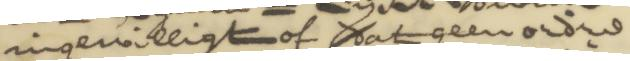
ingewilligt of dat geen ord're
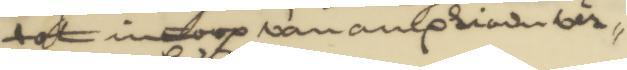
tot inloop van anphioen ver„
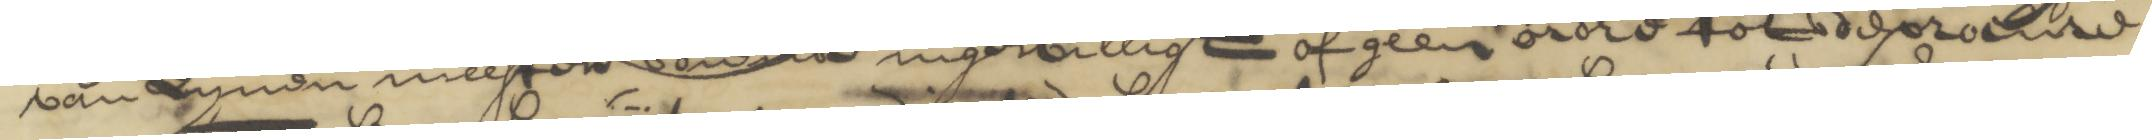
van zijnen meester diende ingewilligt of geen ordre tot de procure
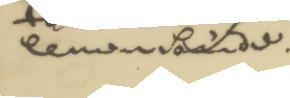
lenen soude.
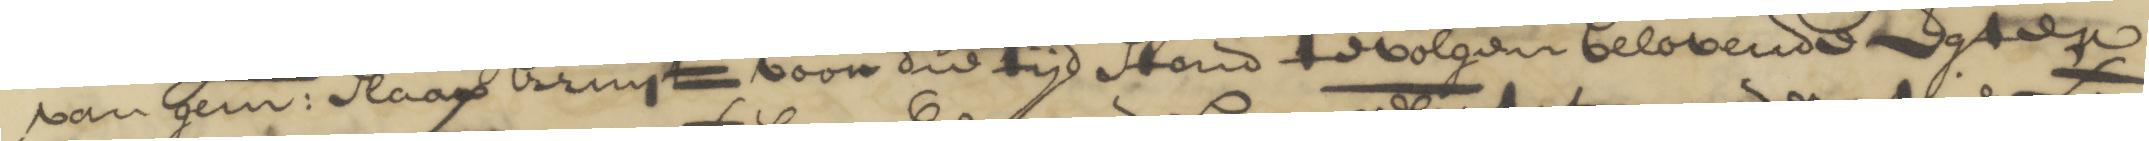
van gem: slaap kruijt voor die tijd stond te volgen belovende Egter
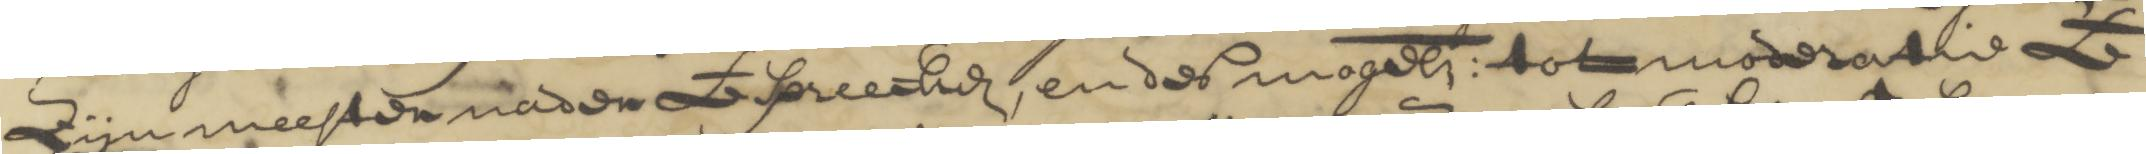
zijn meester nader te spreecken, en des mogelijk: tot moderatie te
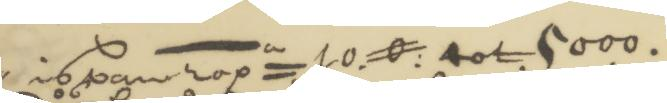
is van rop=a 10. Ø: tot 5000.
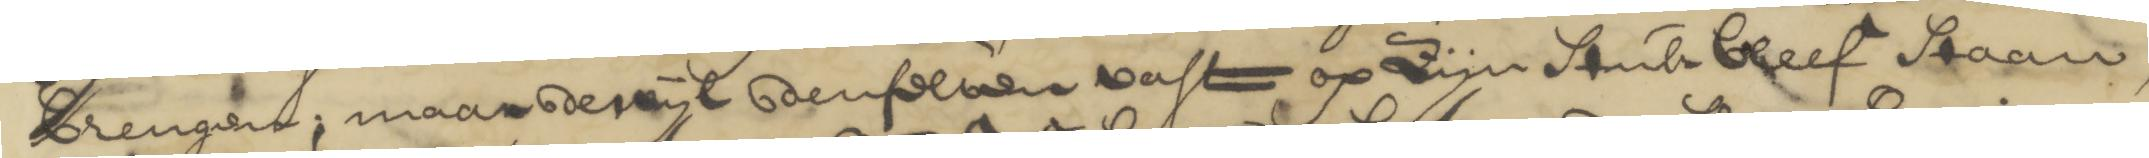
brengen; maar dewijl denselven vast op zijn stuk bleef staan,
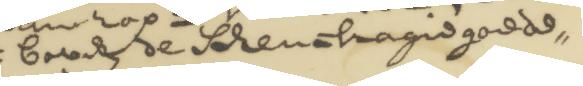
d=os boven de schenckagie goede„
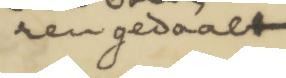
ren gedaalt.
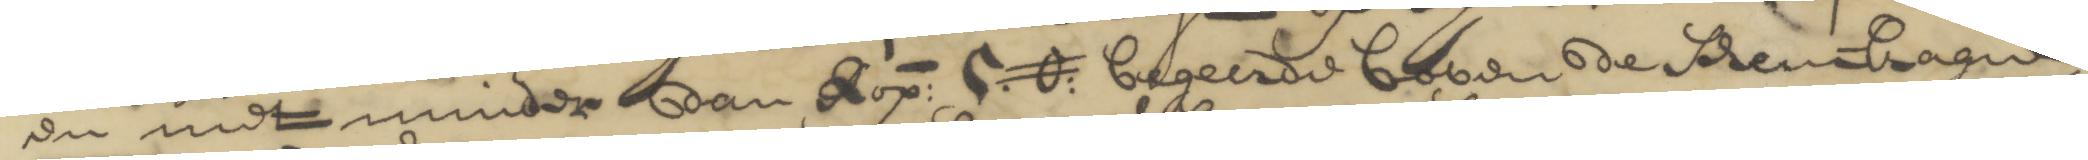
en niet minder dan Rop: 5. Ø: begeerde boven de schenckagie
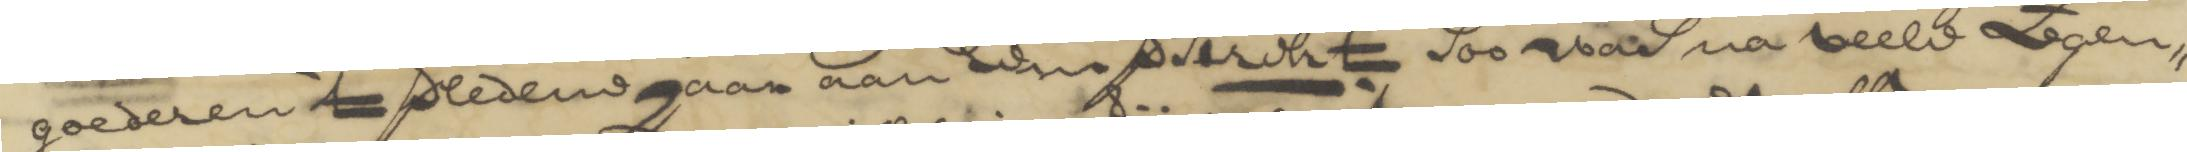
goederen ’t verledene jaar aan hem verstrekt soo was na veele tegen„
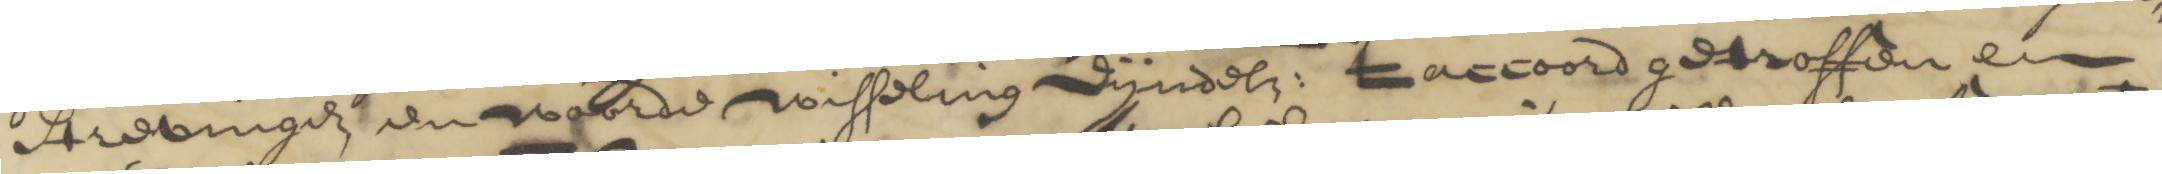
strevingen en woorde wisseling Eijndelijk 't accoord getroffen en
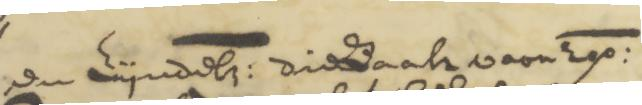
en Eijndelijk die zaak voor rop:
